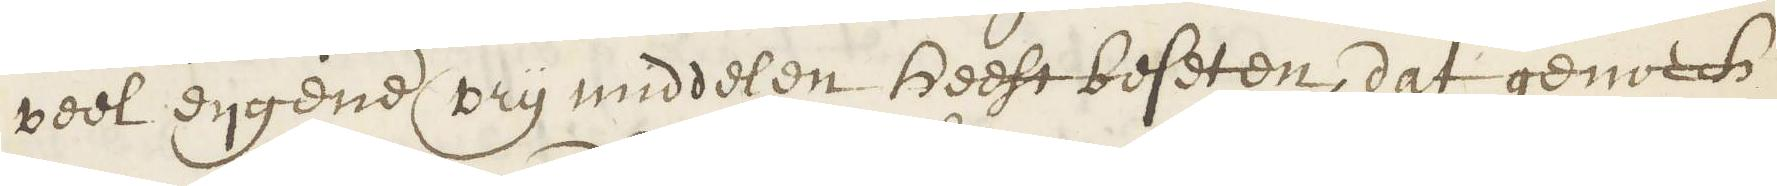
veel eygene vrij middelen heeft beseten, dat genoech
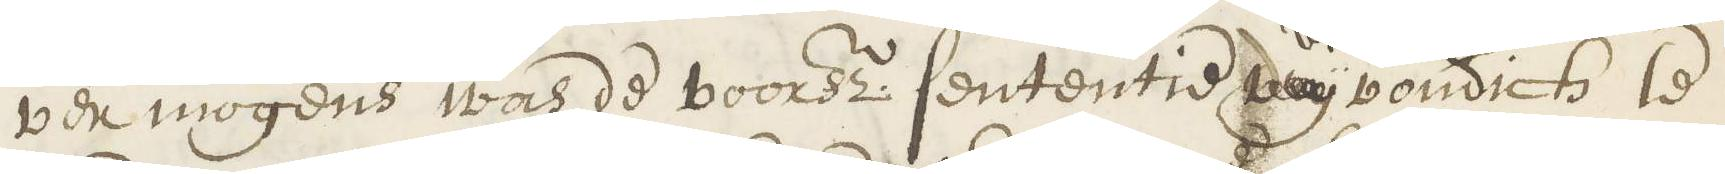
ver mogens was de voorsz: sententie voudich te
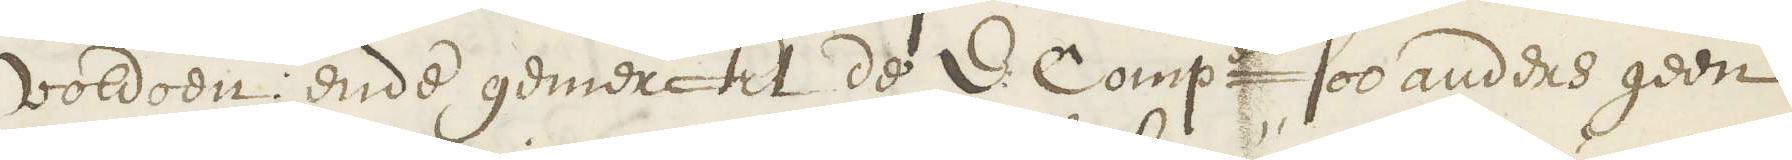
voldoen: ende gemerckt de E: Comp=e soo anders geen
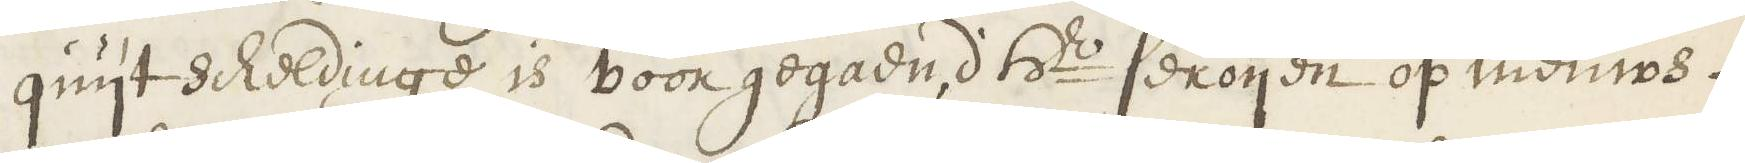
quijtscheldinge is voor gegaen, d’ h=r seroijen op nieuws—
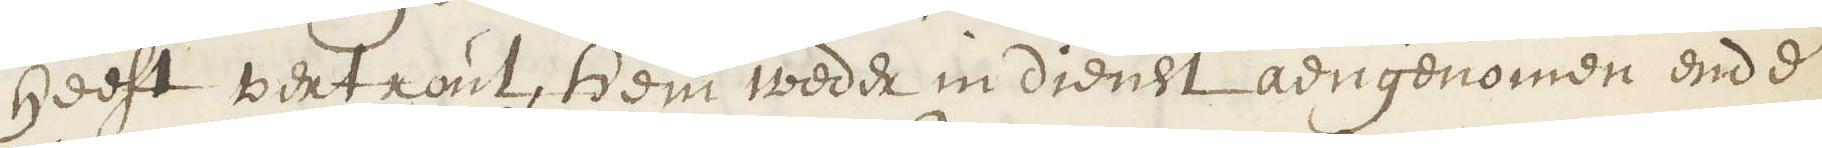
heeft vertrout, hem weder in dienst aengenomen ende
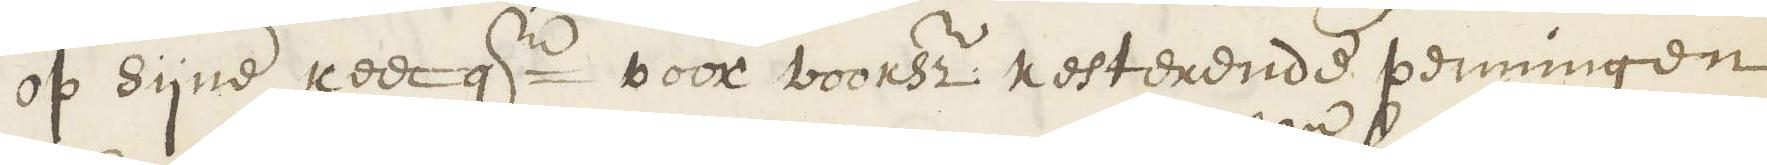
op sijne reecq=n voor voorsz: resterende penningen
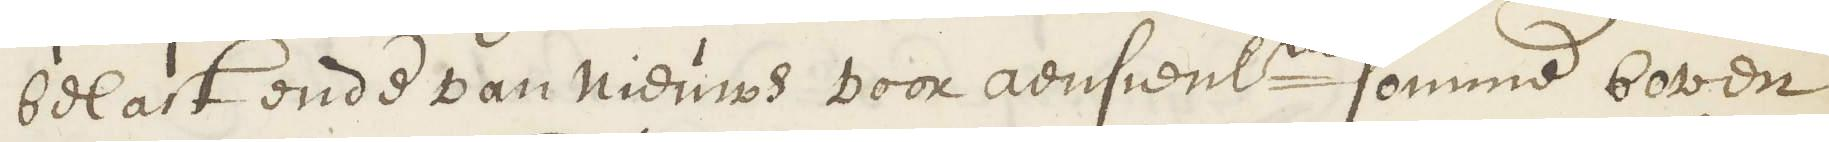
belast ende van nieuws voor aensienl= somme boven
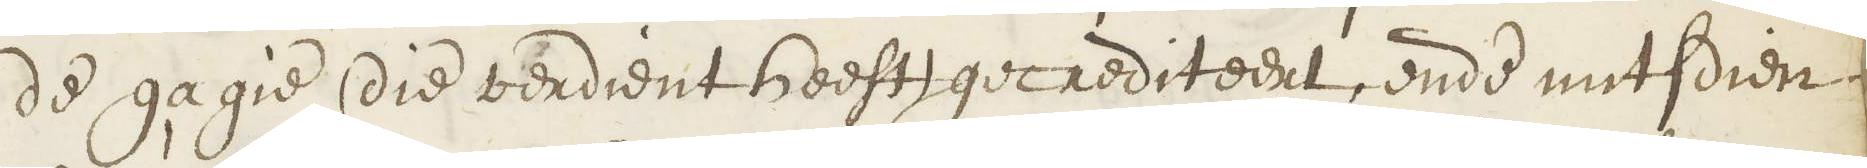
de gagie die verdient heeft gecrediteert, ende mitsdien
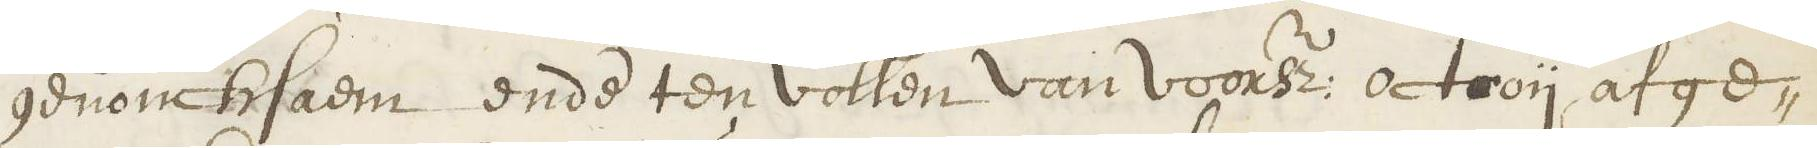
genouchsaem ende ten vollen van voorsz: octroij afge„
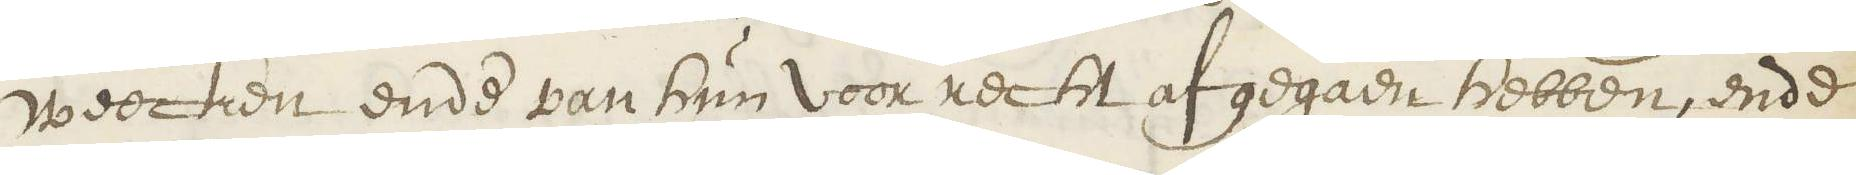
weecken ende van hun voor recht af gegaen hebben, ende
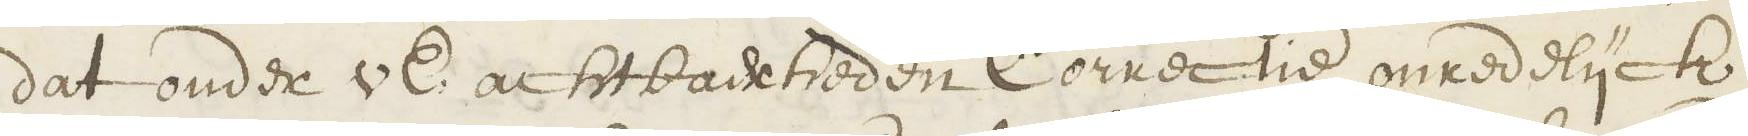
dat onder vE: achtbaerheden Correctie onredelijck
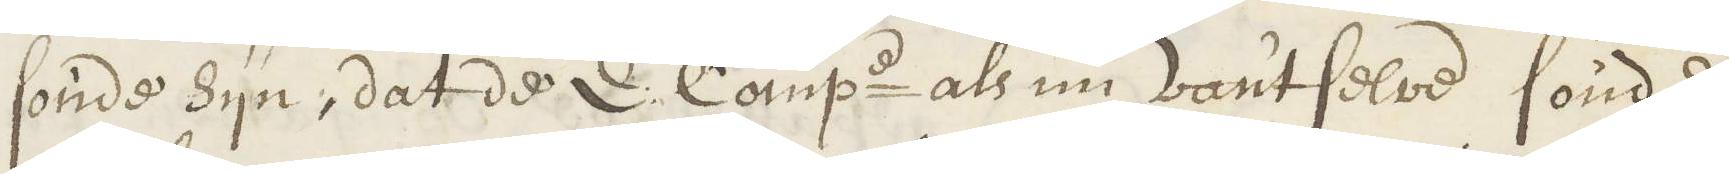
soude sijn, dat de E: Comp=e als nu van’t selve soude
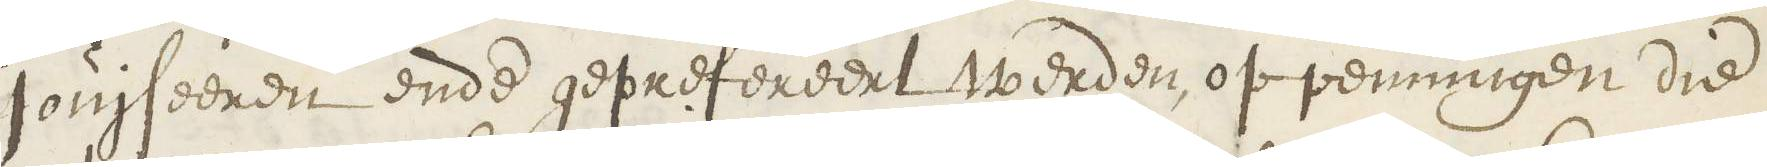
joujseeren ende geprefereert werden, op penningen die
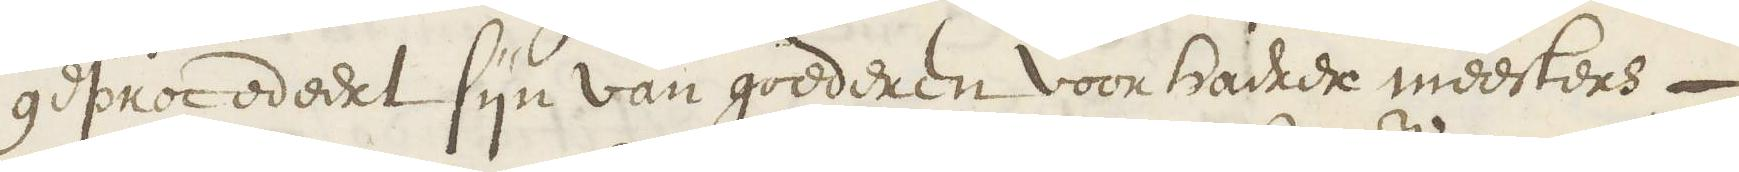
geprocedeert sijn van goederen voor haerer meesters —
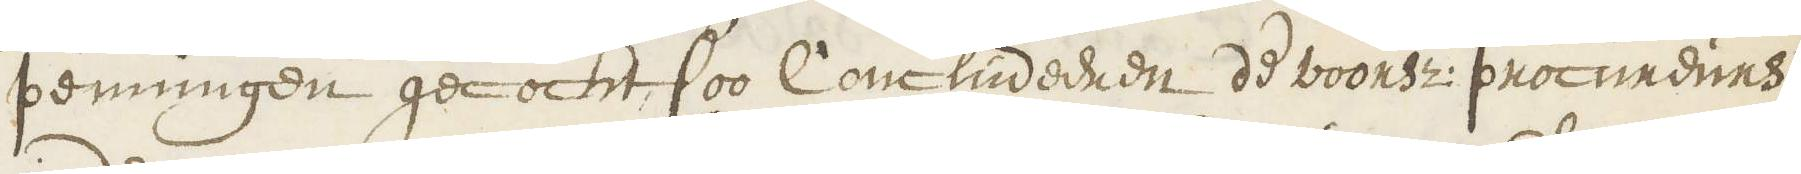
penningen gecocht, soo Concludeeren de voorsz: procureurs
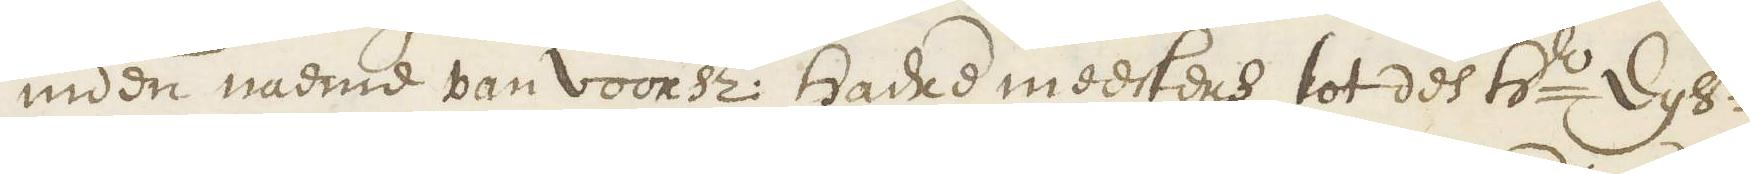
inden naeme van voorsz: haere meesters tot des H=r Eys=rs
